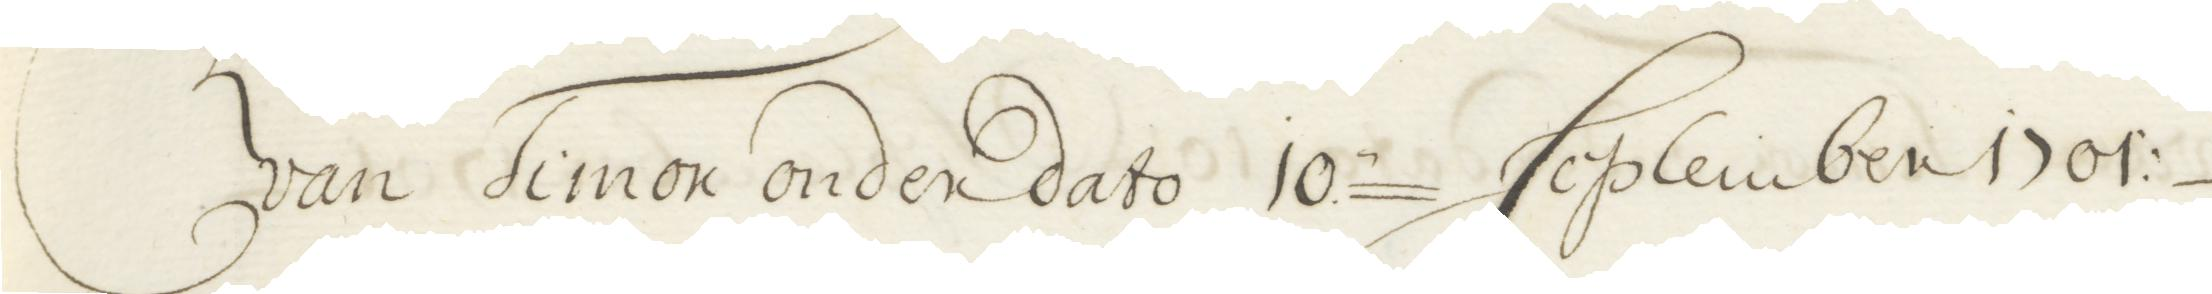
Van Timor onder dato 10=en September 1701:—
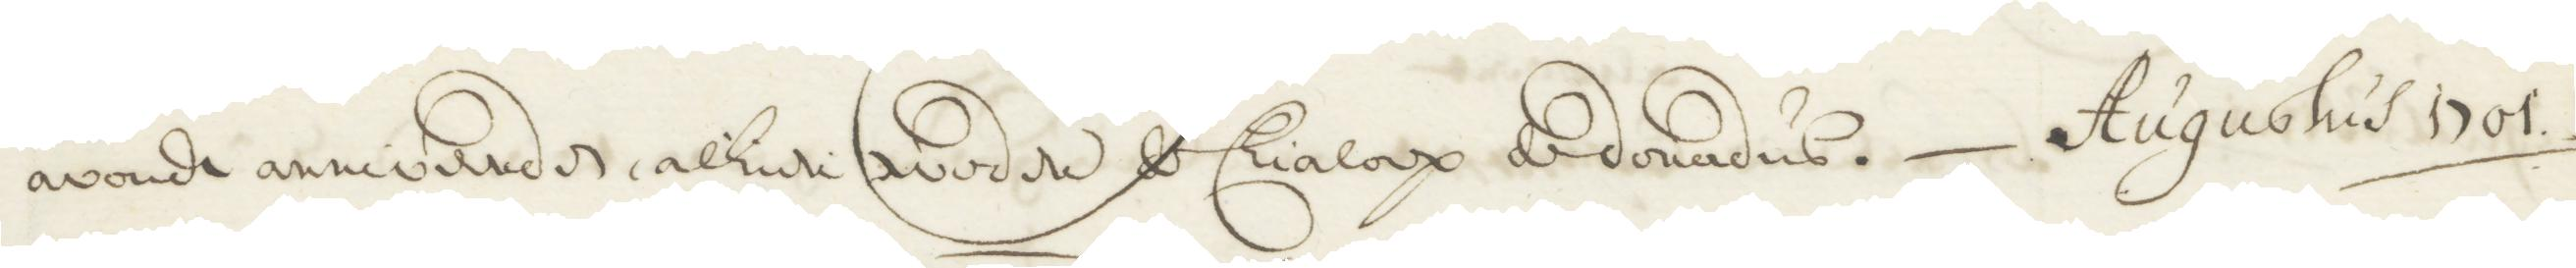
avondt arriveerden, alhier weder de chialoep de doradus. — Augustus 1701.
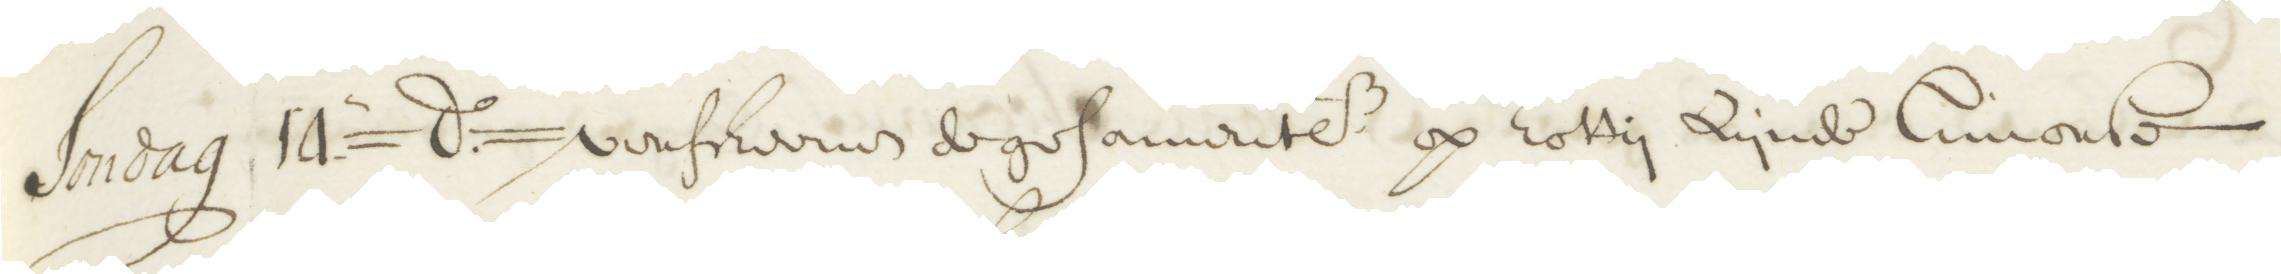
Sondag 14=en d=o verscheenen de gesamentlijk op rottij zijnde Timorse
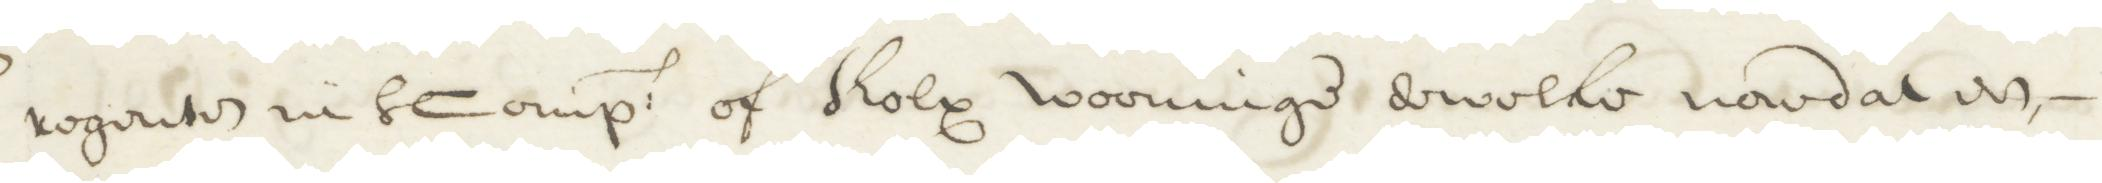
regenten in sComp:s of dholx wooninge dewelke naedat en,-
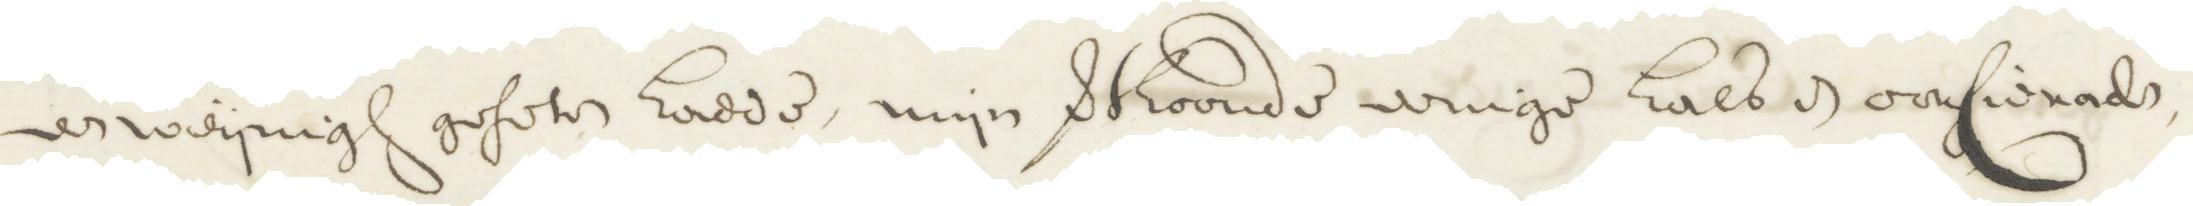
een weijnigh geseten hadde, mijn verthoonde eenige hals en oorcieraden,
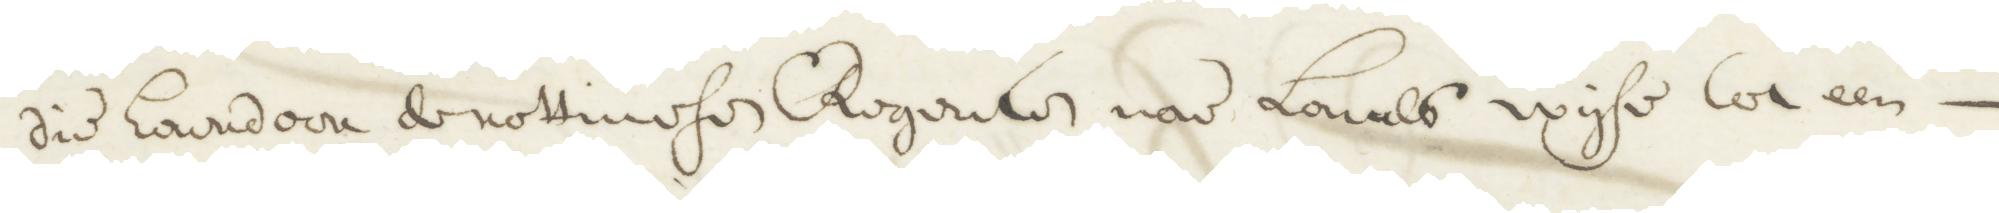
die haerdoor de rottinesen Regenten nae Lonals wijse tot een —
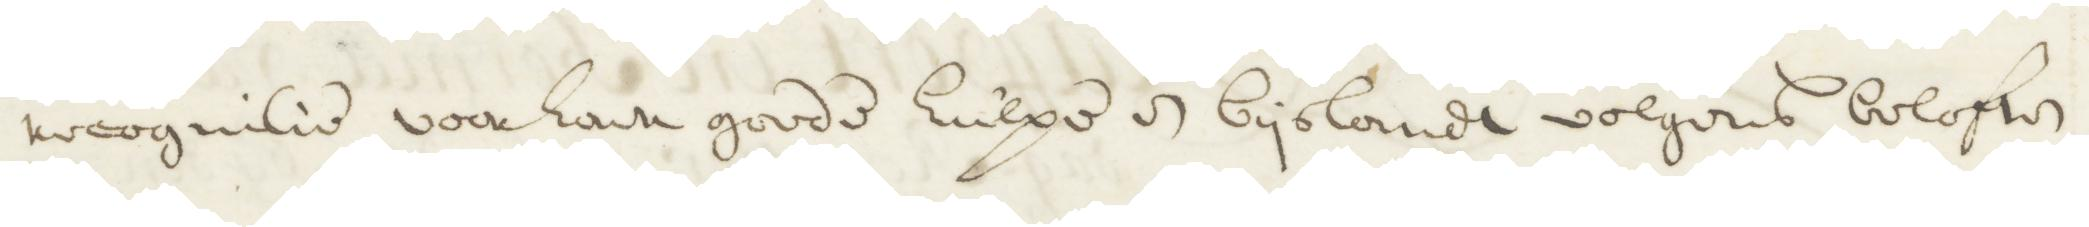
recognitie voor haer goede hulpe en bijstande volgens beloften
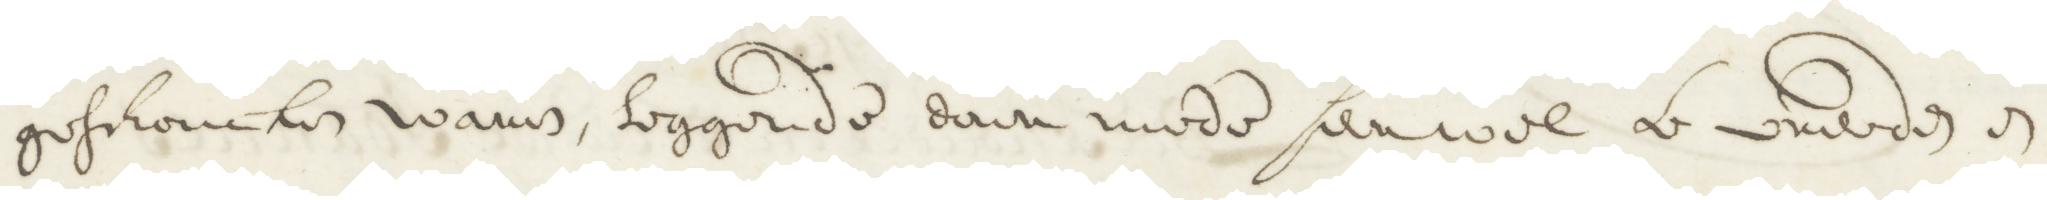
geschoncken waren, seggende daer mede seer wel te vreeden en
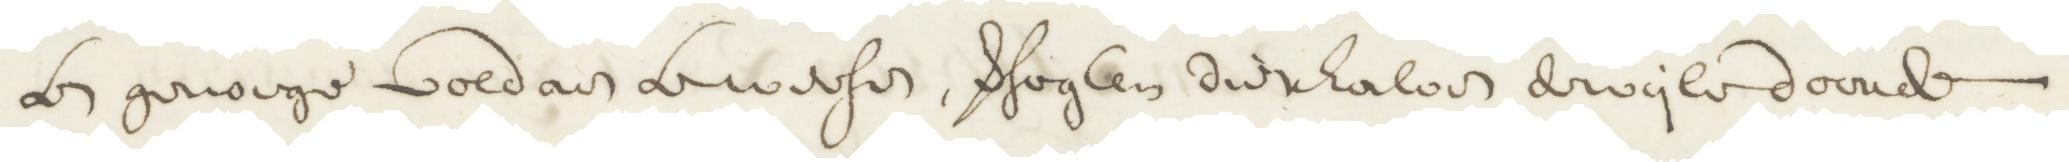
ten genoege voldaen te weesen, versogten dierhalven dewijle doorde
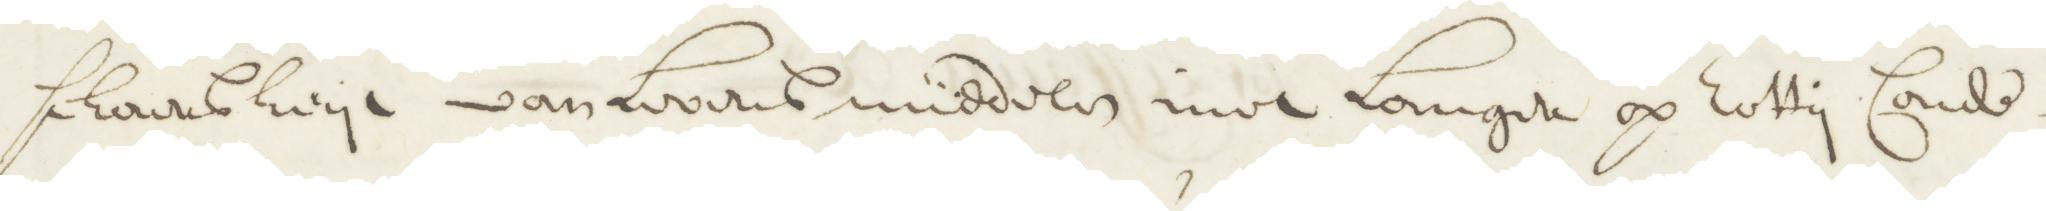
schaersheijt van levens middelen niet langer op rottij conde
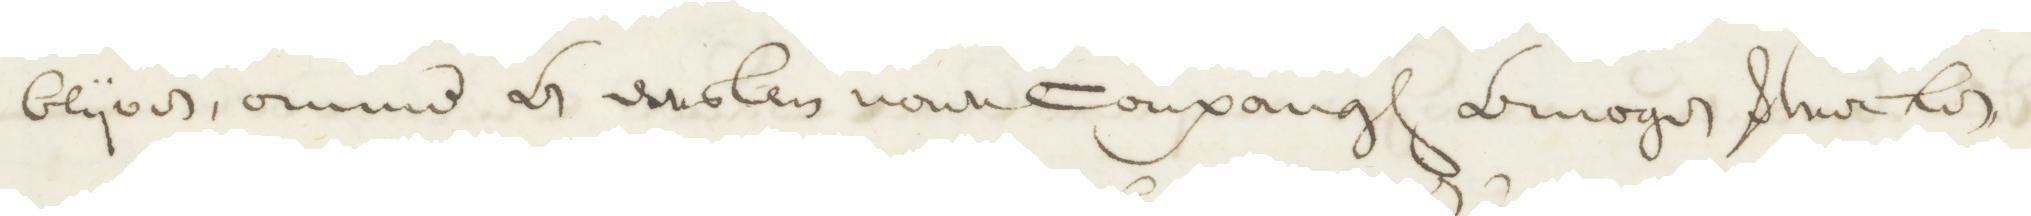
blijven, omme ten eersten naer Coupangh temogen vertrecken,
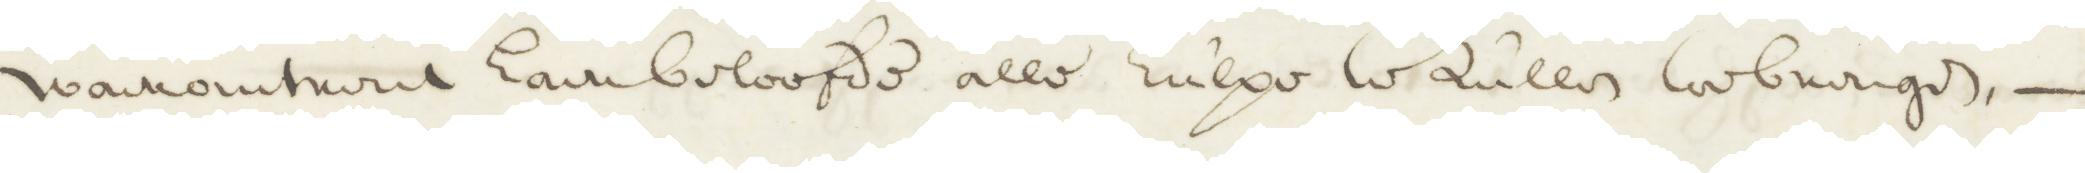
waeromtrent haer beloofde alle hulpe te zullen toebrengen, —
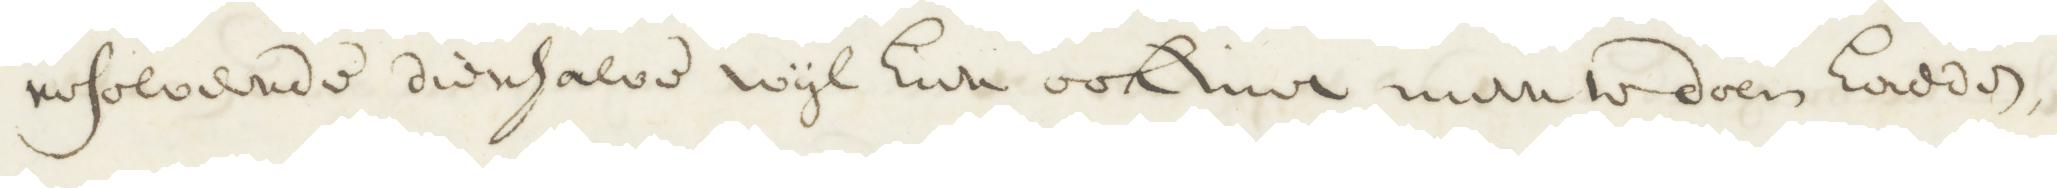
resolveerde dierhalve wijl hier ook niet meer te doen haeden,
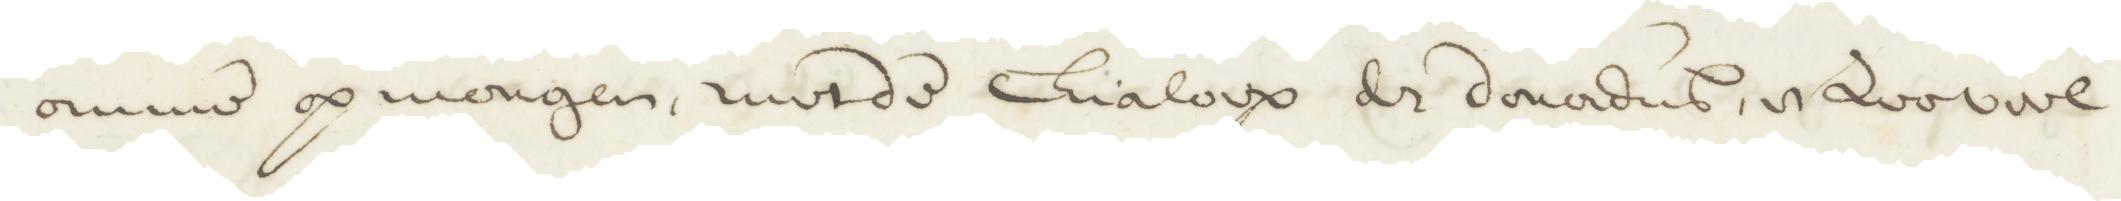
omme op morgen, met de Chialoep de doradus, en zoo veel
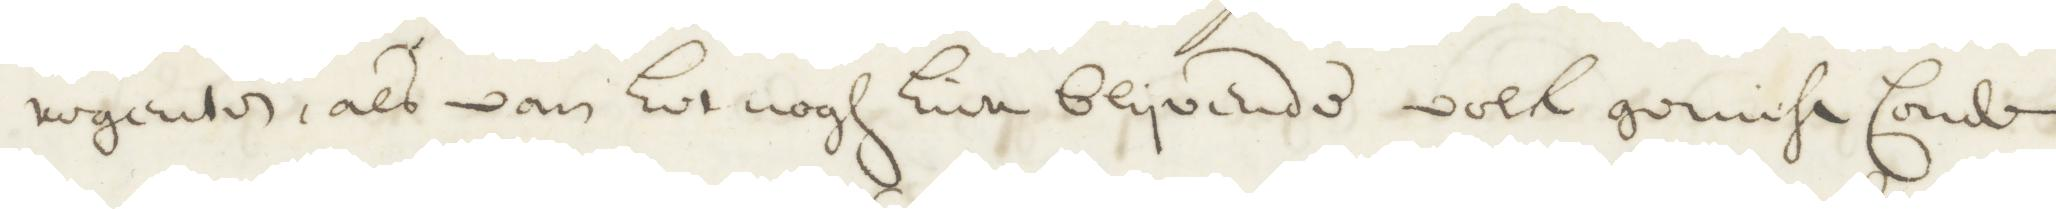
regenten, als van het nogh hier blijvende volk gemist conde
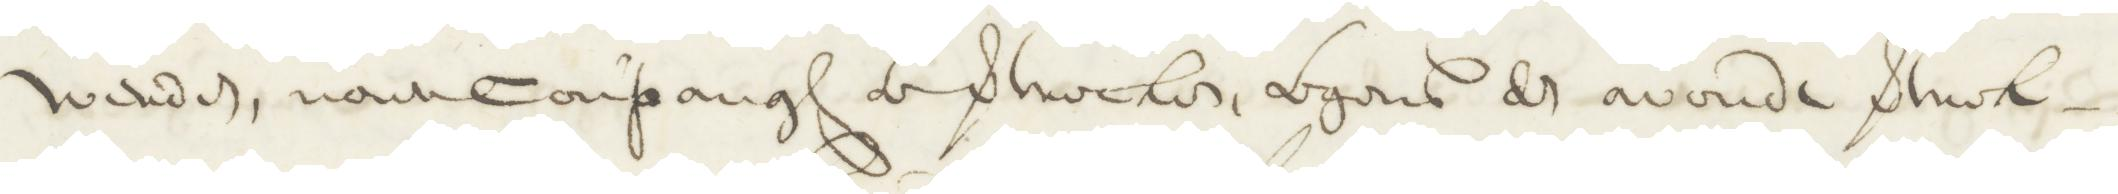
werden, naer Coupangh te vertrecken, tegens den avondt vertrek
